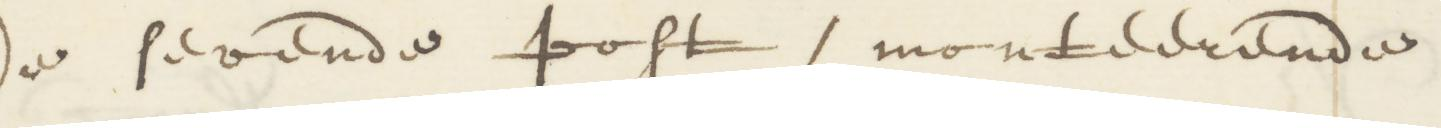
De sevende post, monteerende
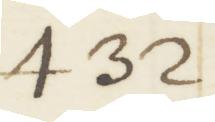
432
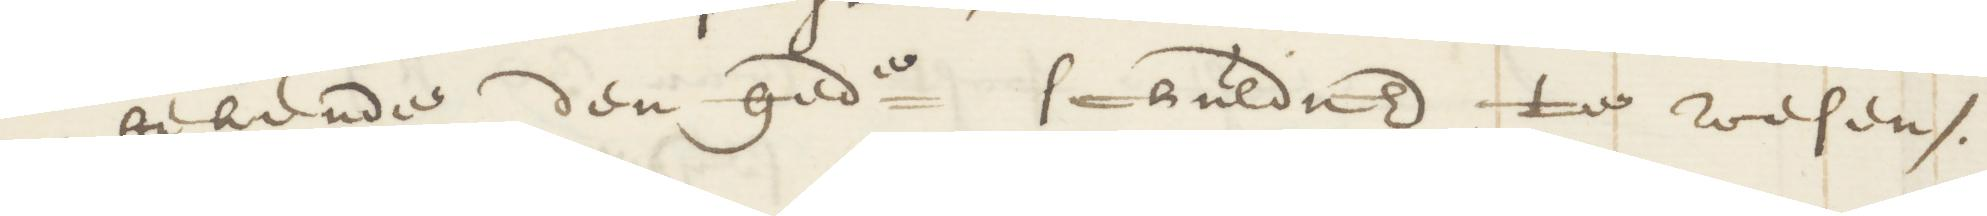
bekende den ged=e schuldich te wesen/.
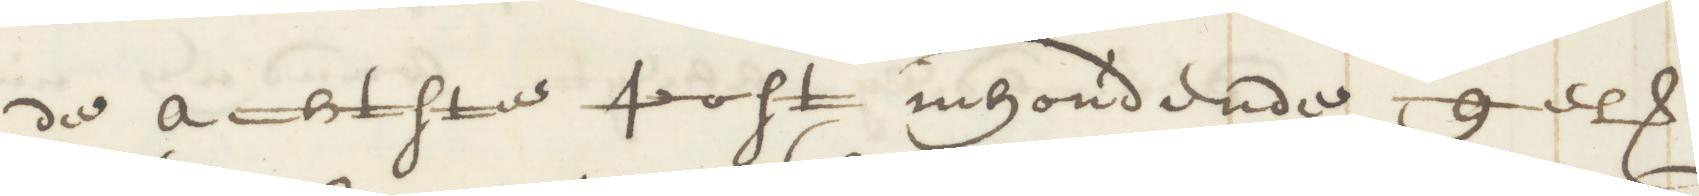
Op de achtste post inhoudende gelver
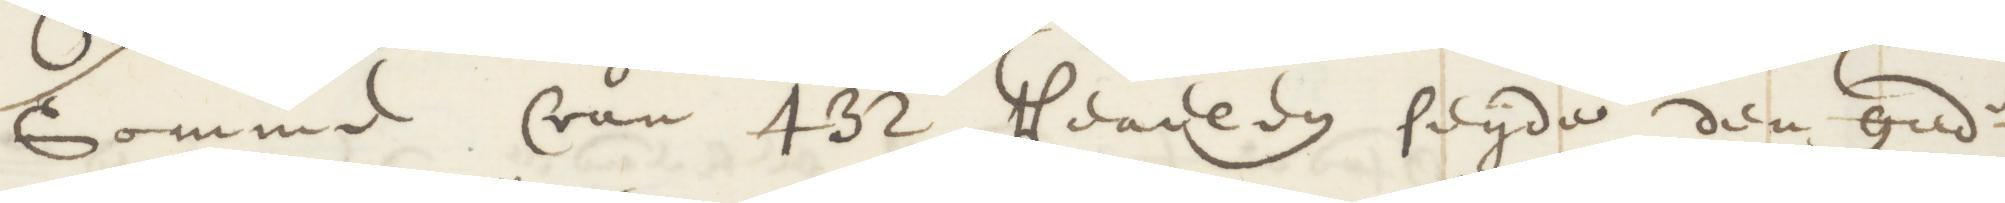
somme van 132 Reaelen seijde den ged:
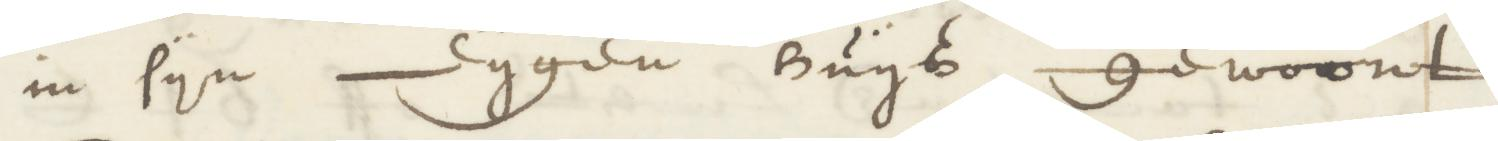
in sijn Eijgen huijs gewoont
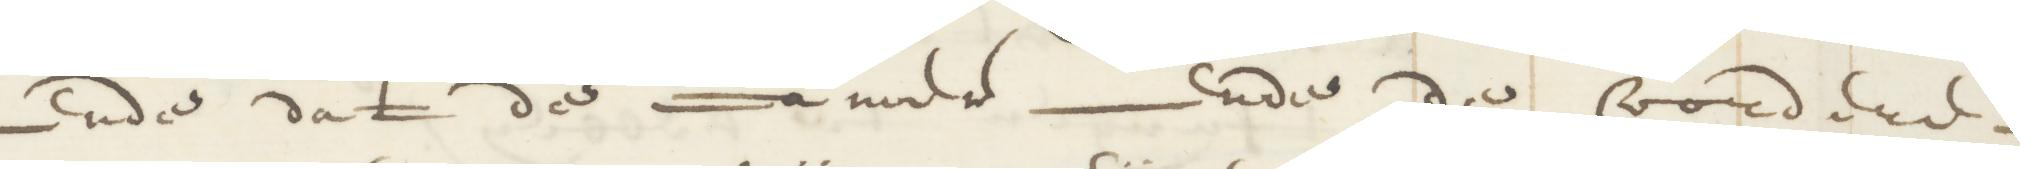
Ende dat de camer ende de vordere-
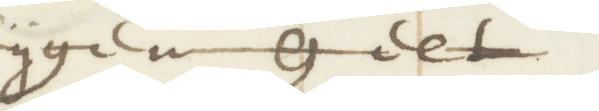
ijgen gelt
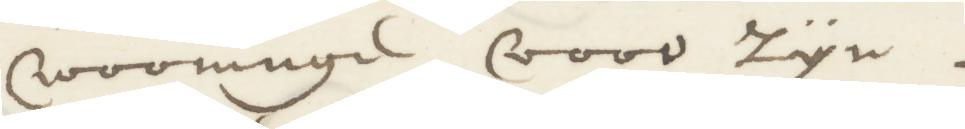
wooninge voor zijn.
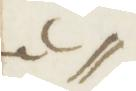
e„
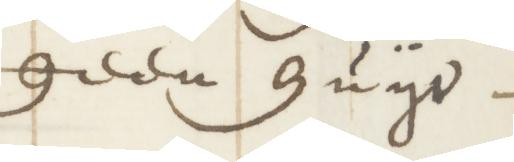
geen huijr-
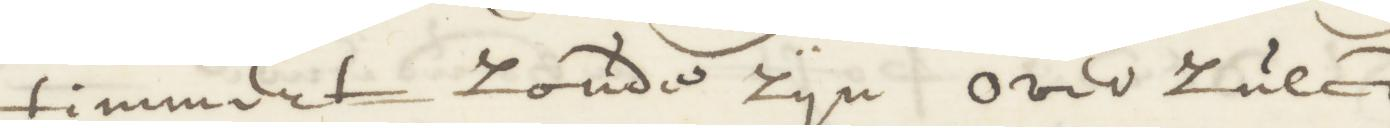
timmert zoude zijn over zulxc
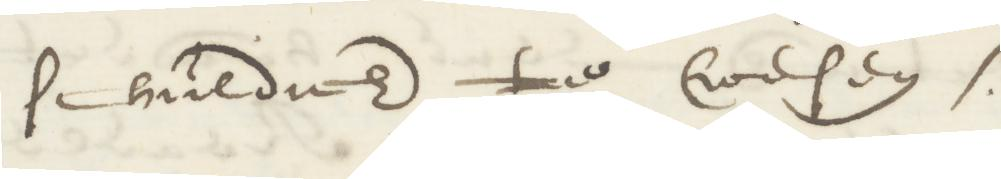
schuldich te wesen/.
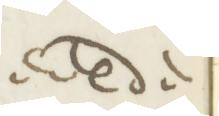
eelde
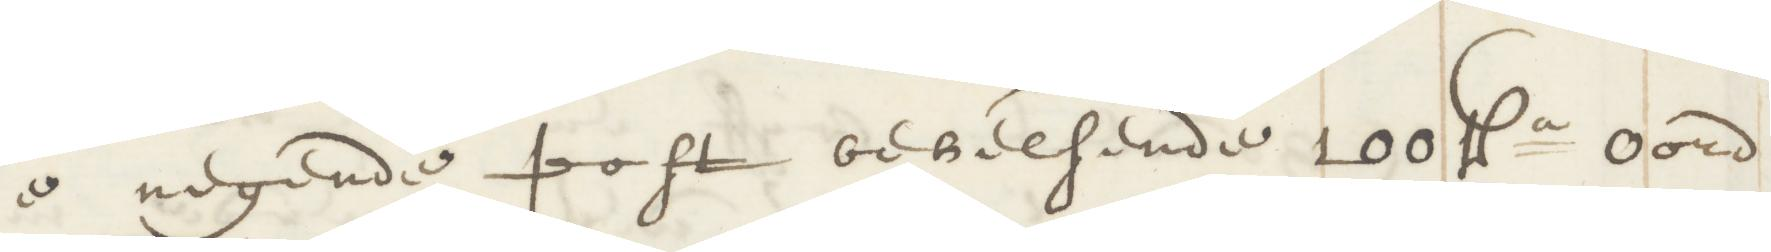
De negende post behelsende 100 R=a oord
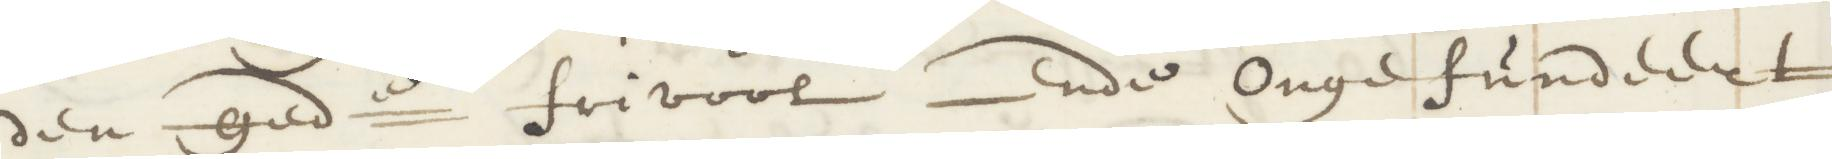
den ged=e frivool ende Ongefundeert
